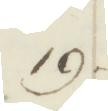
19.
